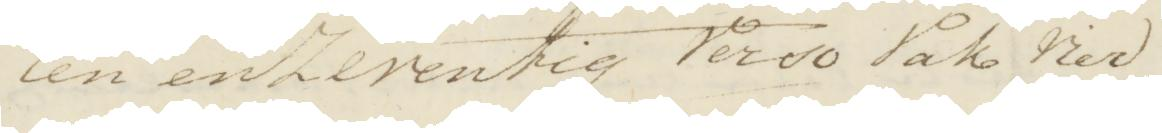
Een en Zeventig Verso Vak vier
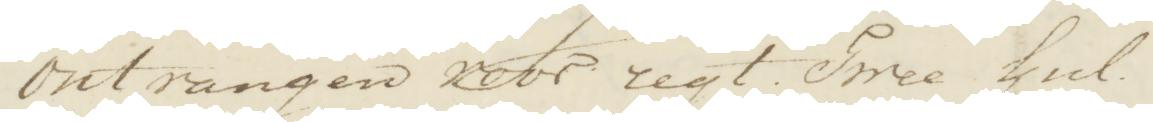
ontvangen voor: regt. Twee Gul.
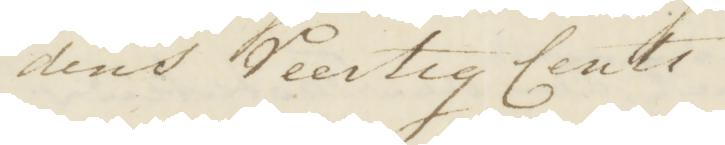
dens Veertig Cents
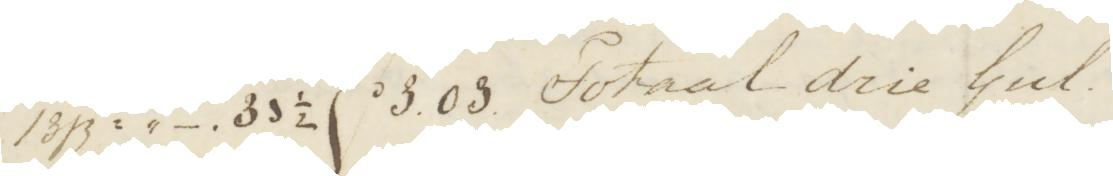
13 p½„ —. 33½ 3.03. Totaal drie Gul.
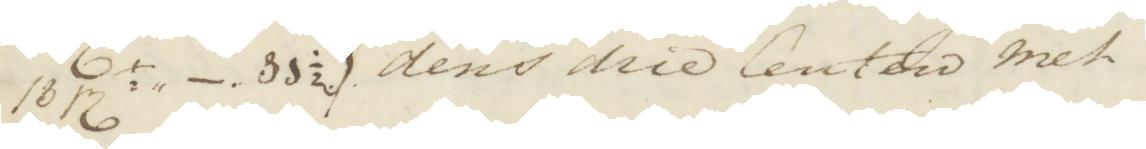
13 p½„ —. 35:. dens drie Centen met
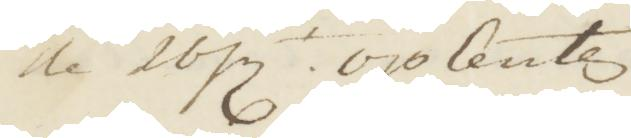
de 26 p„t op Centen
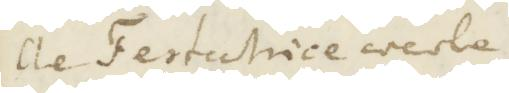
de Testatrice overle
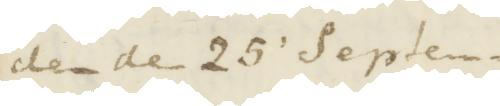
den de 25' Septem=
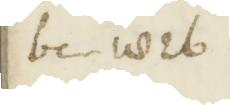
ber 1826
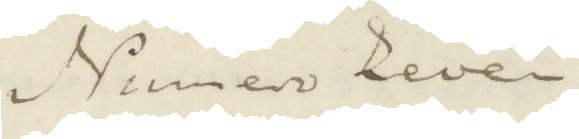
Numero Zeven
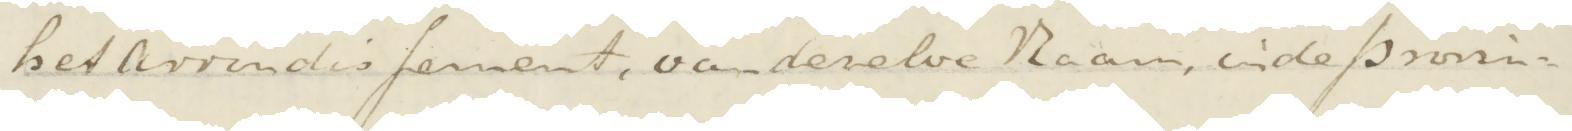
het Arrondissement, van dezelve Naam, in de provin=
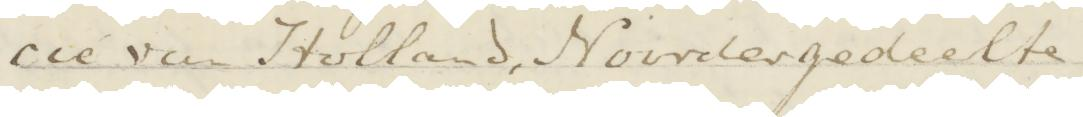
=cie van Holland, Noordergedeelte
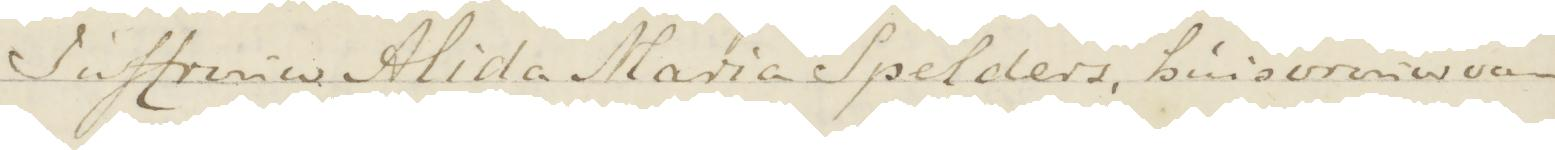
Juffrouw Alida Maria Spelders, huisvrouw van
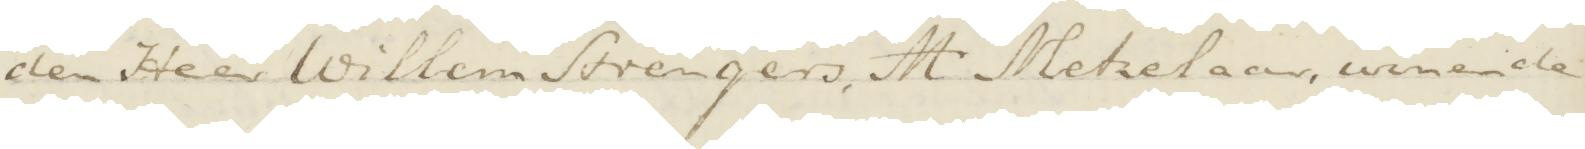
den Heer Willem Strengers, Metzelaar, wonende
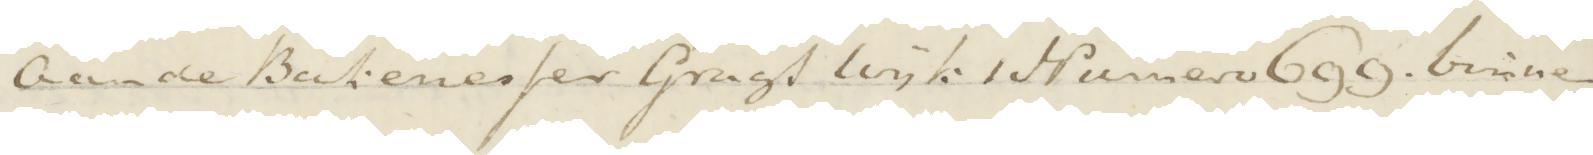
aan de Bakenesser Gragt wijk Numero 699. binnen
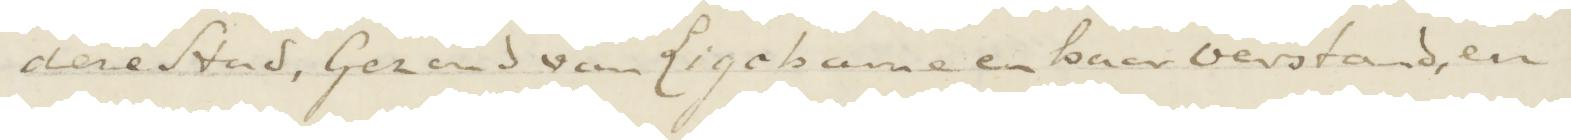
deze stad, Gezond van Ligchame en haar verstand, en
